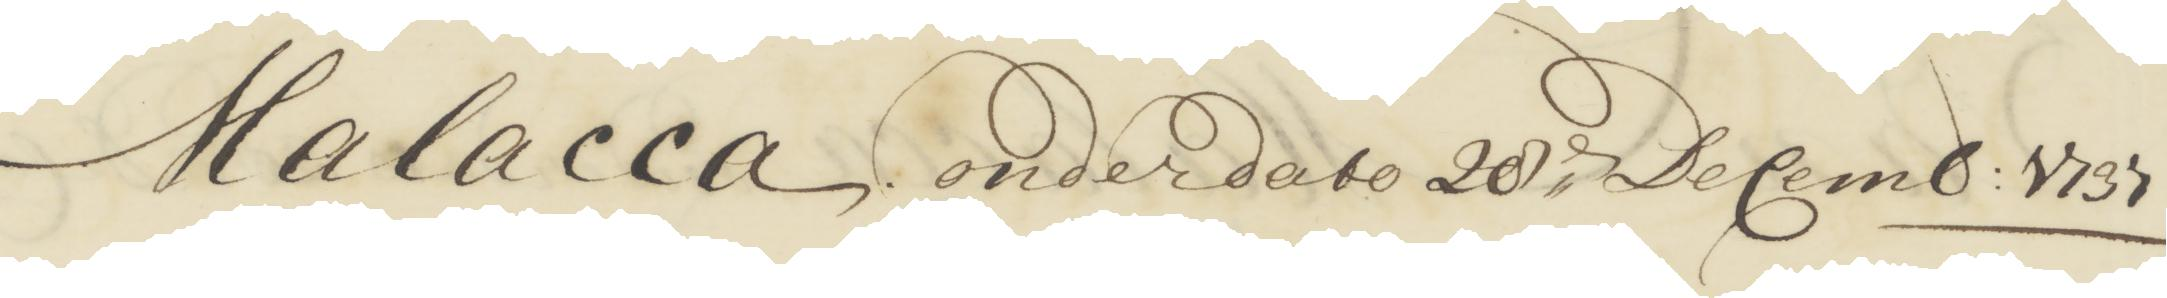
Van Malacca onderdato 28„en Decemb: 1737
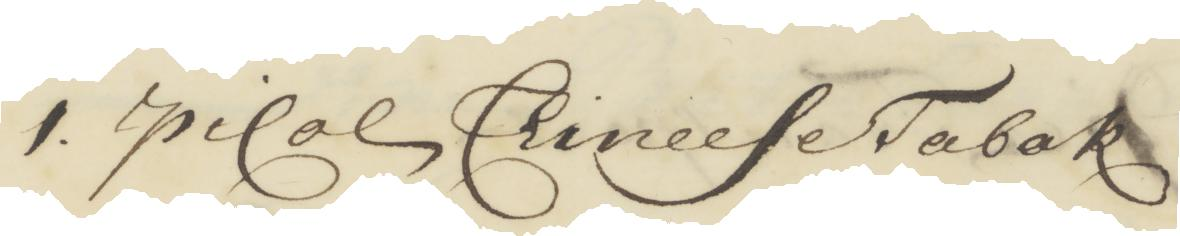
1. picol Chineese Tabak
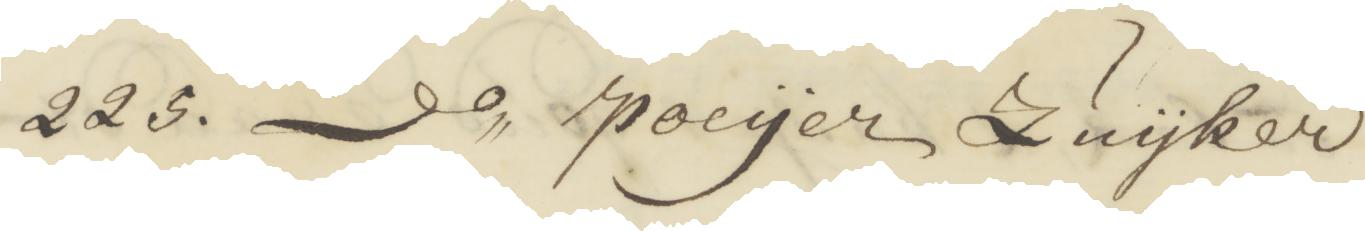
225. _„o poeijer zuijker
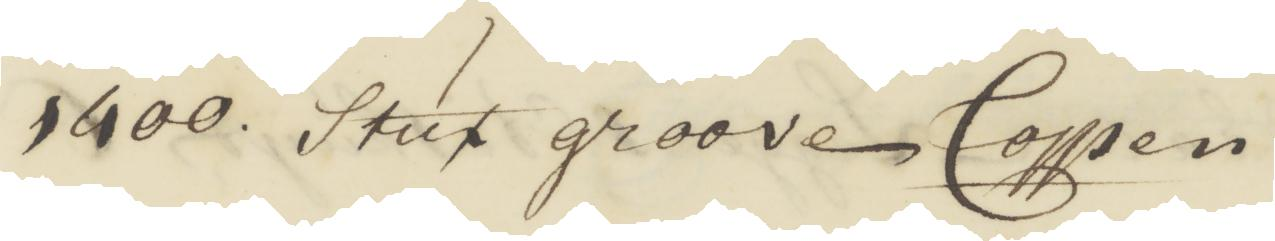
1400. stux groove Coppen
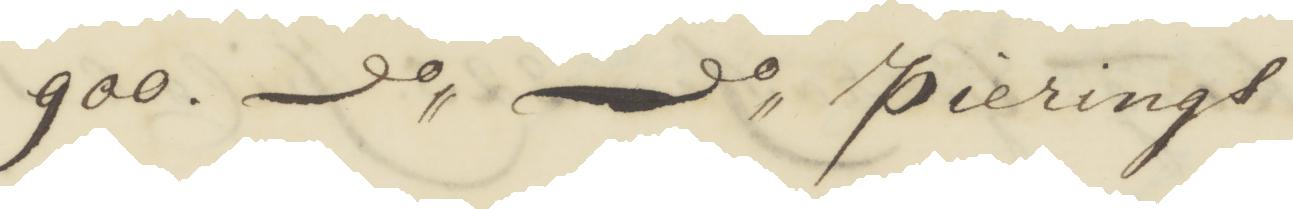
900. _„o _„o pierings
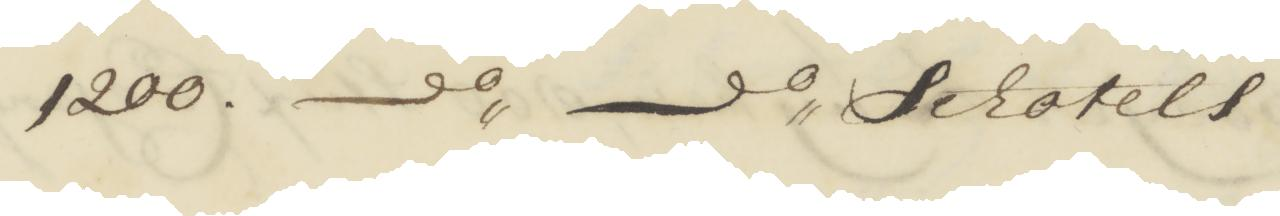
1200. _„o _„o Schotels
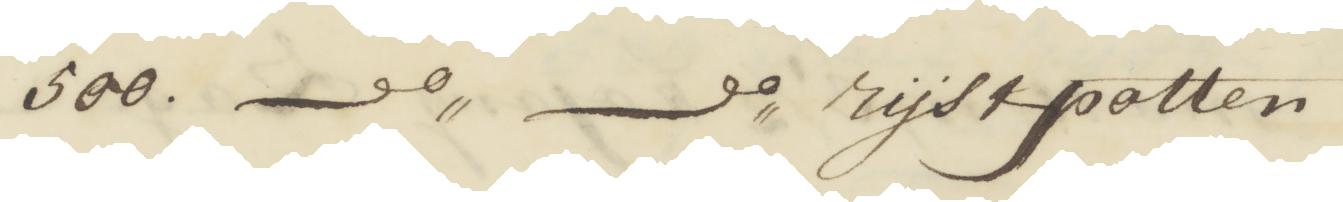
500. _„o _„o rijstpotten
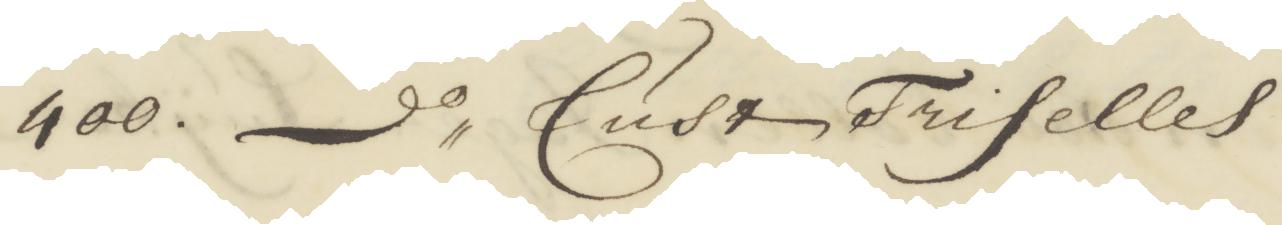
400. _„o Cust Friselles
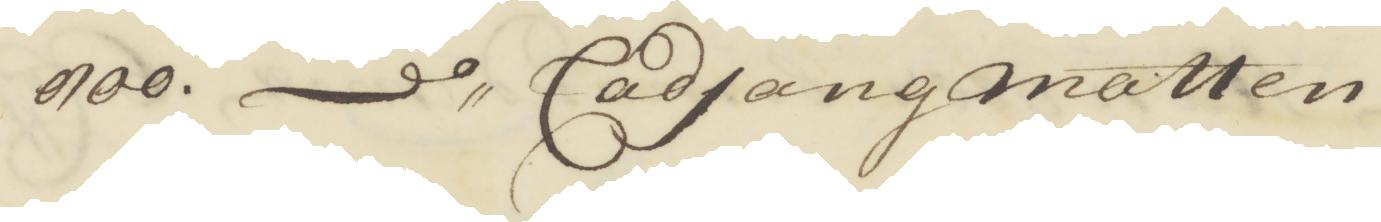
800. _„o Cadjang matten
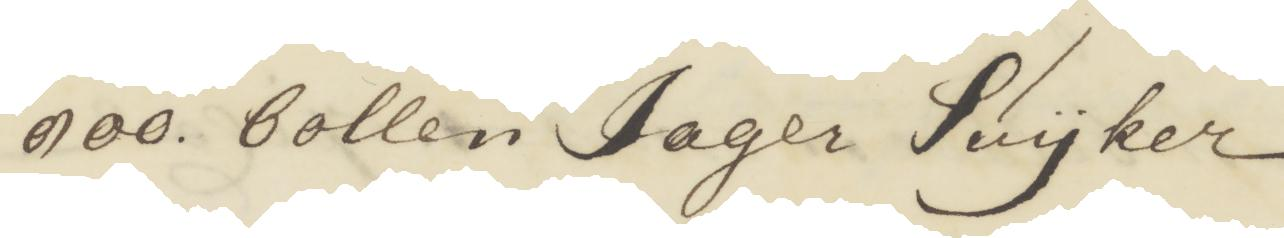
800. bollen Jager suijker
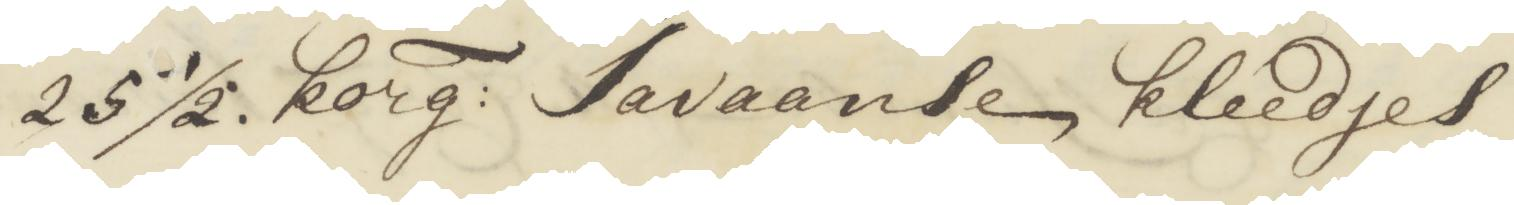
25½. korg: Javaanse kleedjes
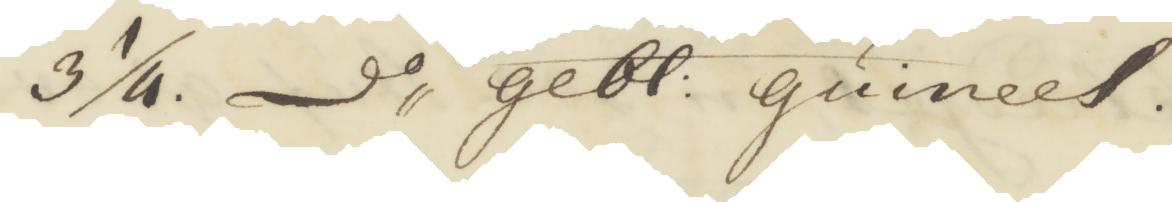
3¼. _„o gebl: guinees.
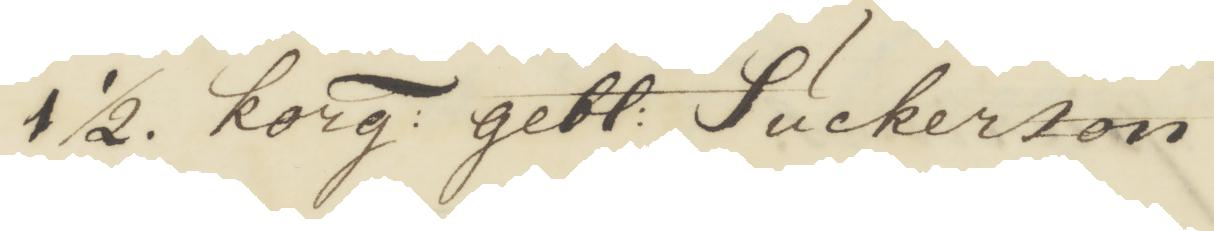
1½. korg: gebl: suckerton
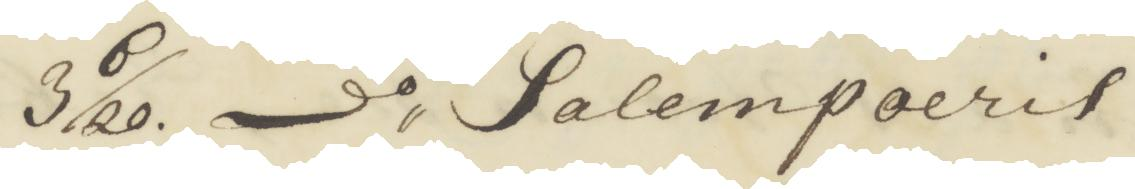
3 6/20. _„o salempoeris
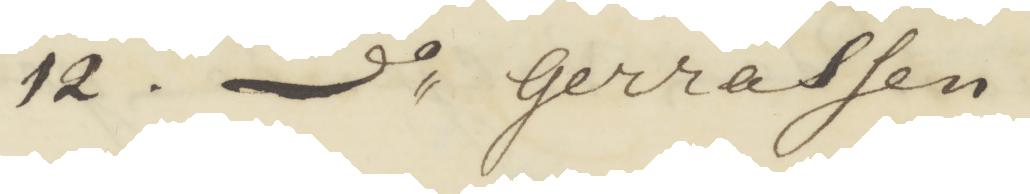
12. _„o gerrassen
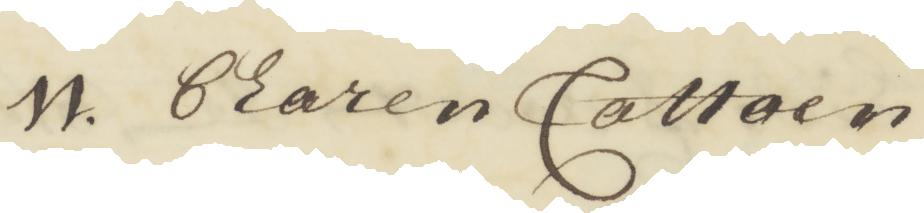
11. bharen Cattoen
